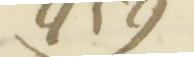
959
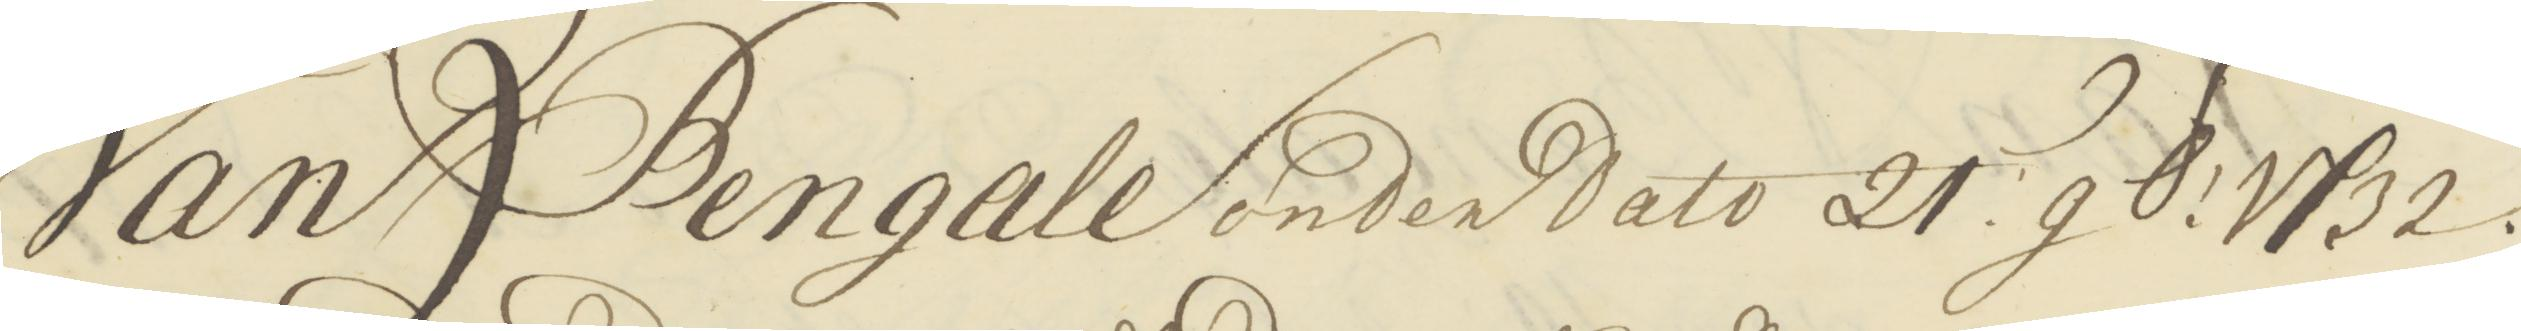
Van Bengale onder dato 21:' 9b:r 1732.
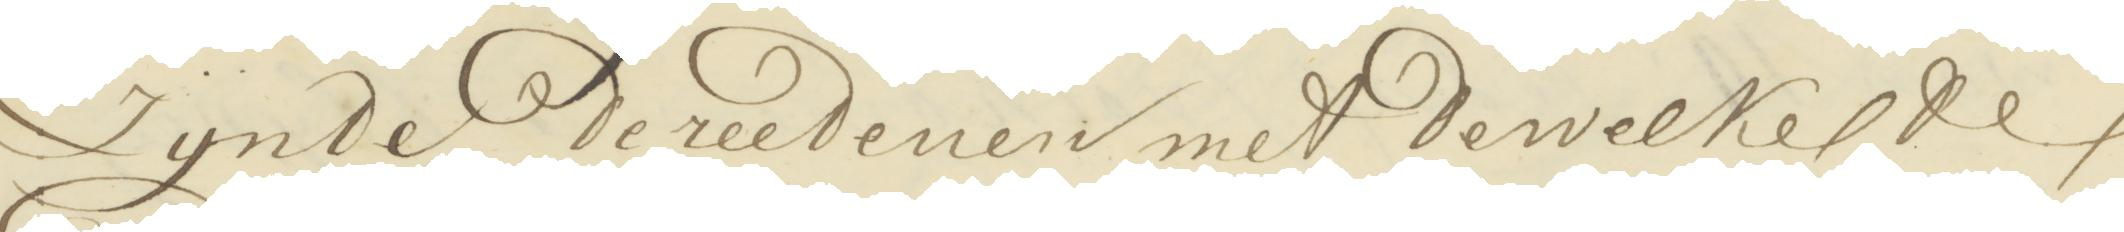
Zijnde de reedenen met dewelke de
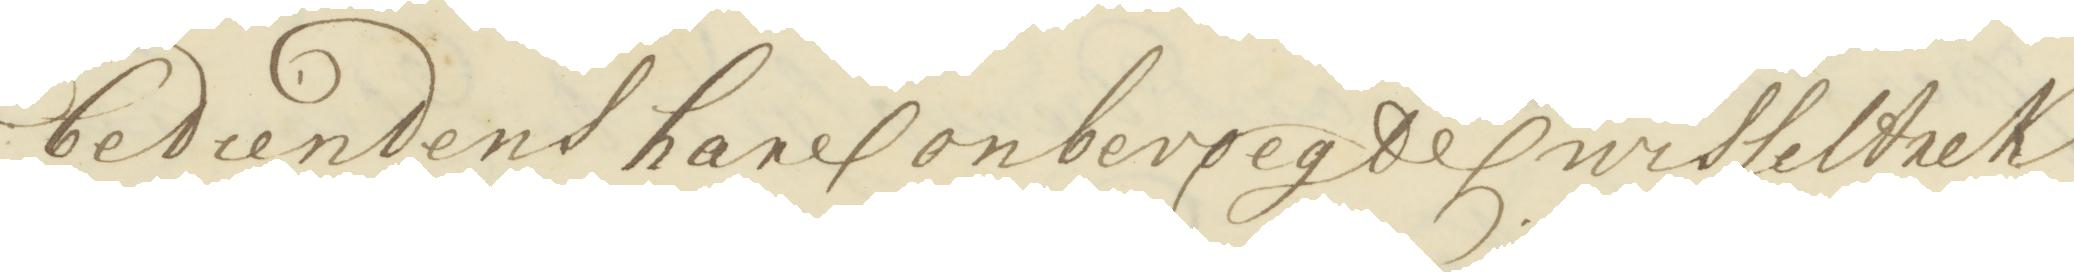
bediendens hare onbevoegde wisseltrek
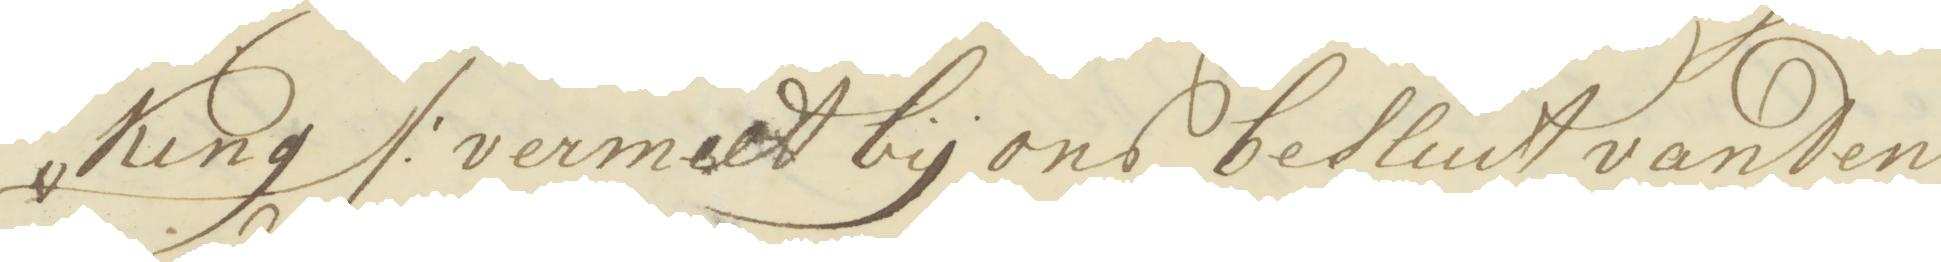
„king /: vermelt bij ons besluit van den
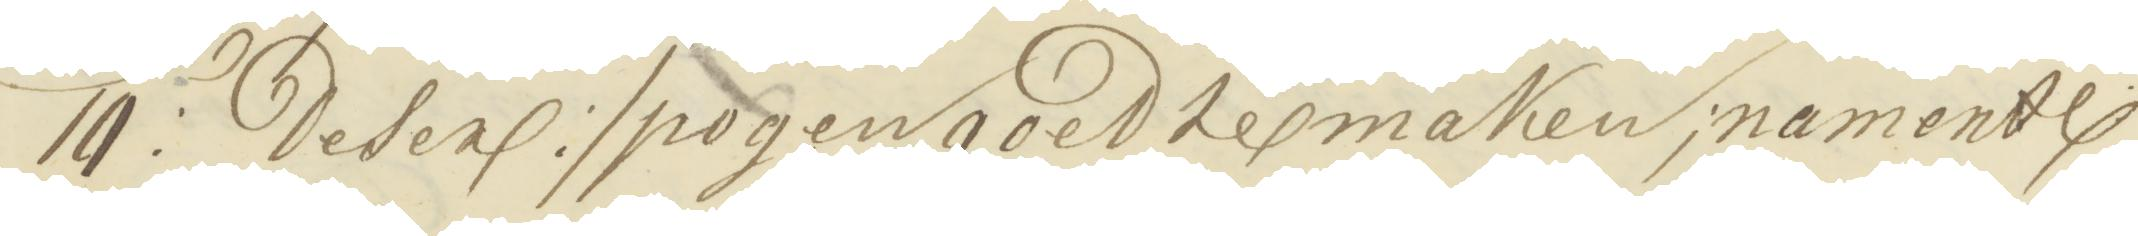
14:' deser :/ pogen goed temaken; namentlijk
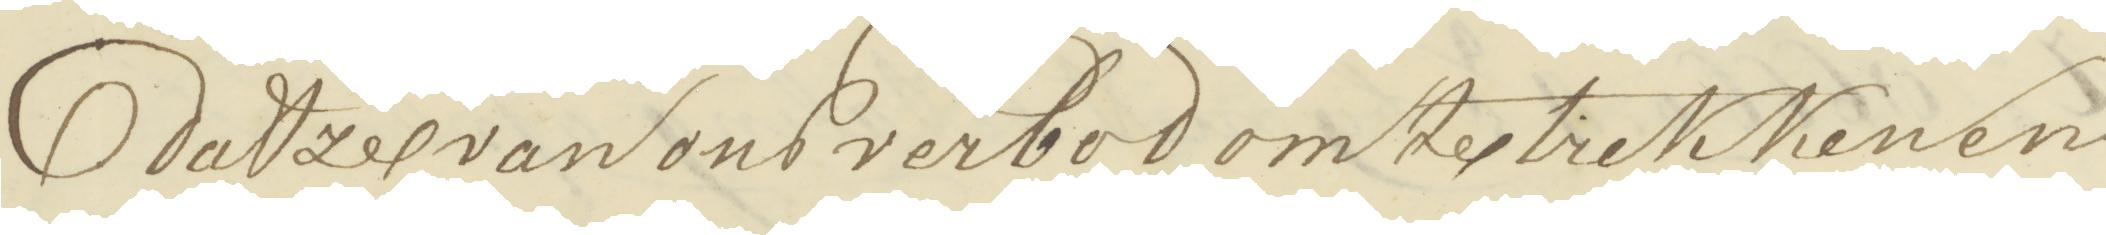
dat ze van ons verbod om te trekken en
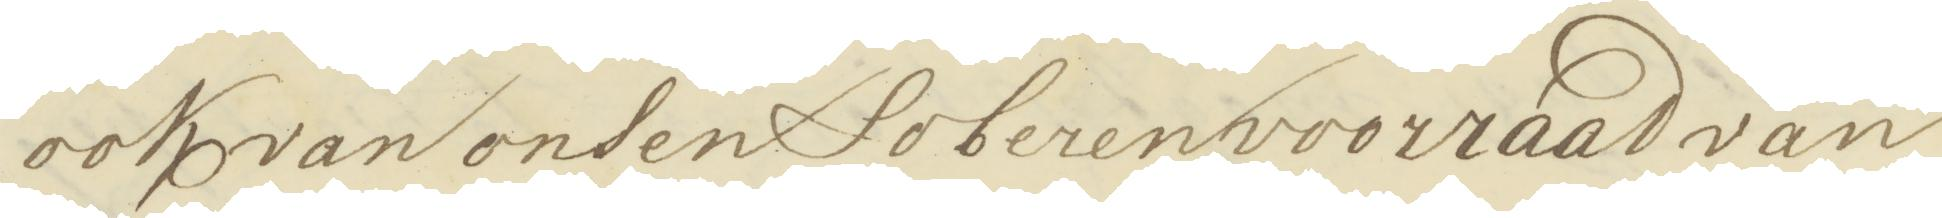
ook van onsen Soberen voorraad van
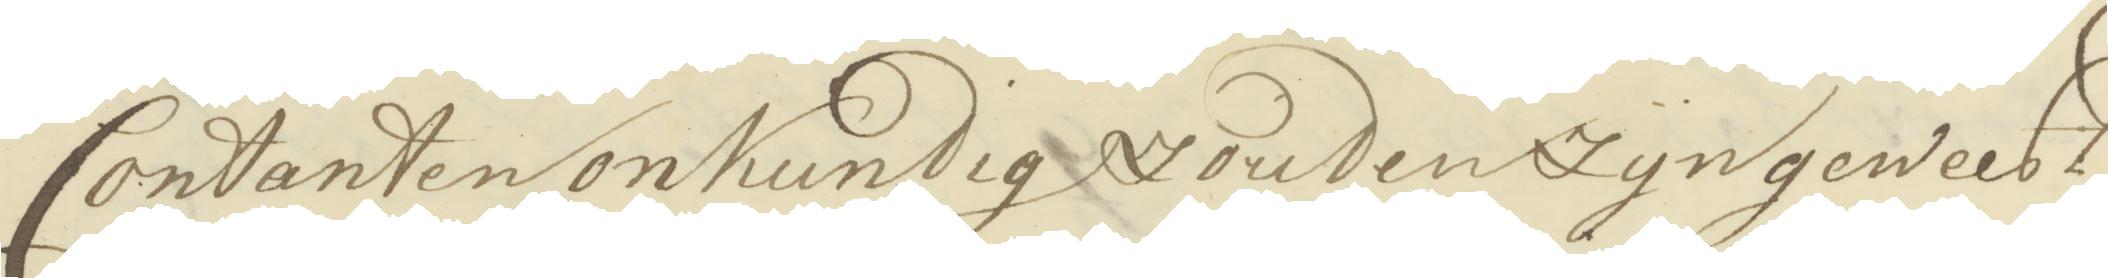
Contanten onkundig zouden zijn geweest
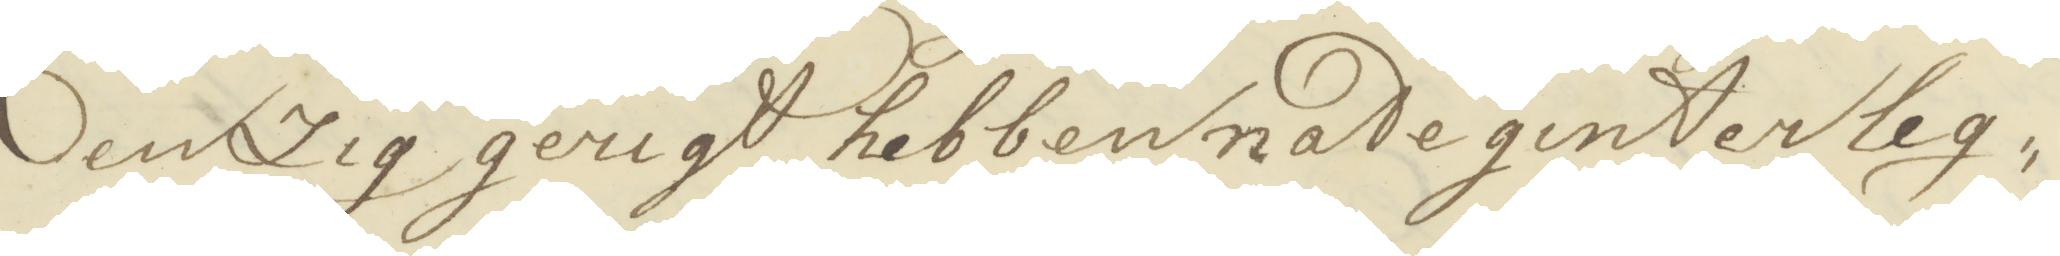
en zig gerigt hebben na de ginter leg„
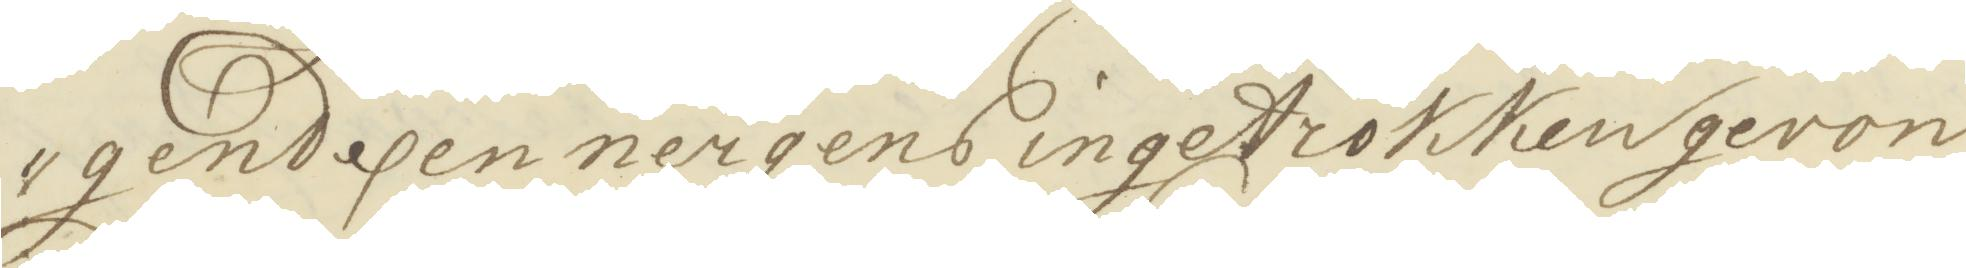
„gende en nergens ingetrokken gevon
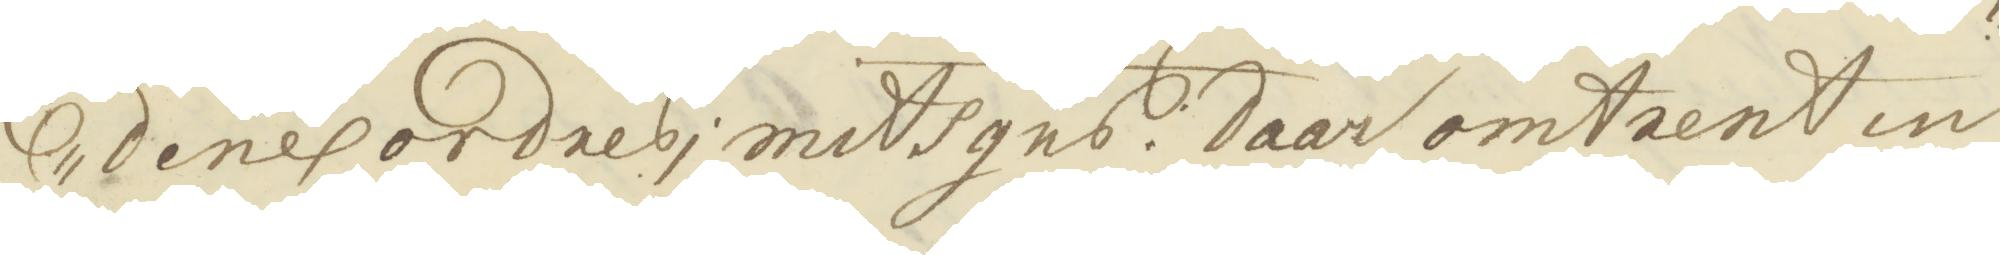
„dene ordres, mitsgrs: daar omtrent in
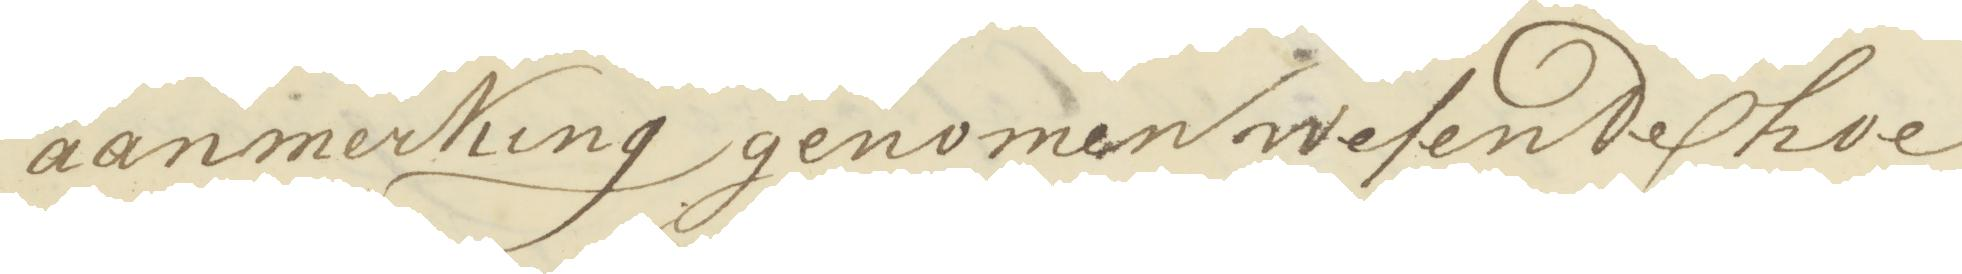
aanmerking genomen wesende hoe
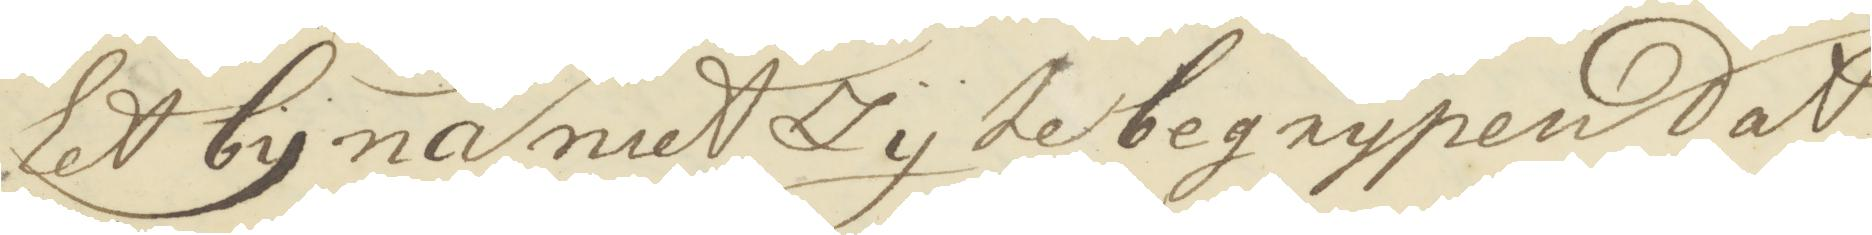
het bijna niet Zij te begrijpen dat
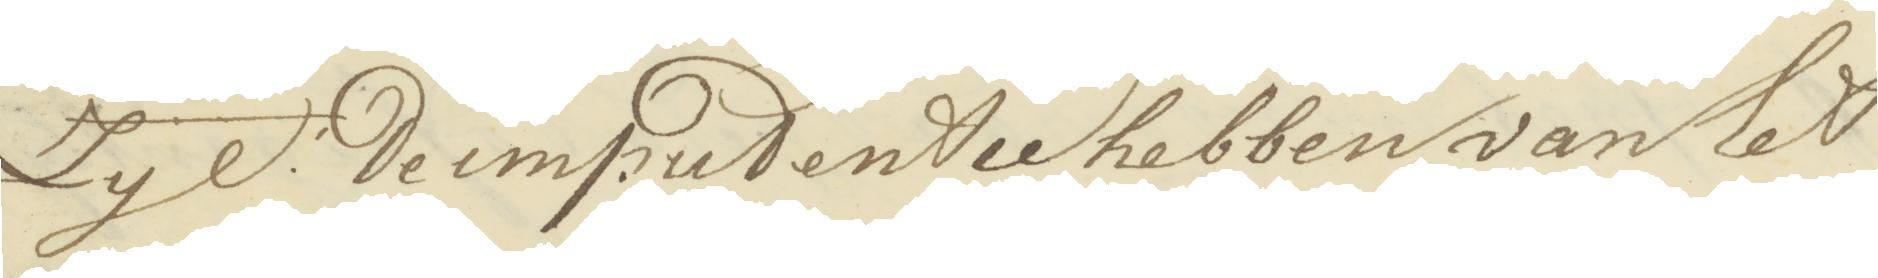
Zij l: de impudentie hebben van het
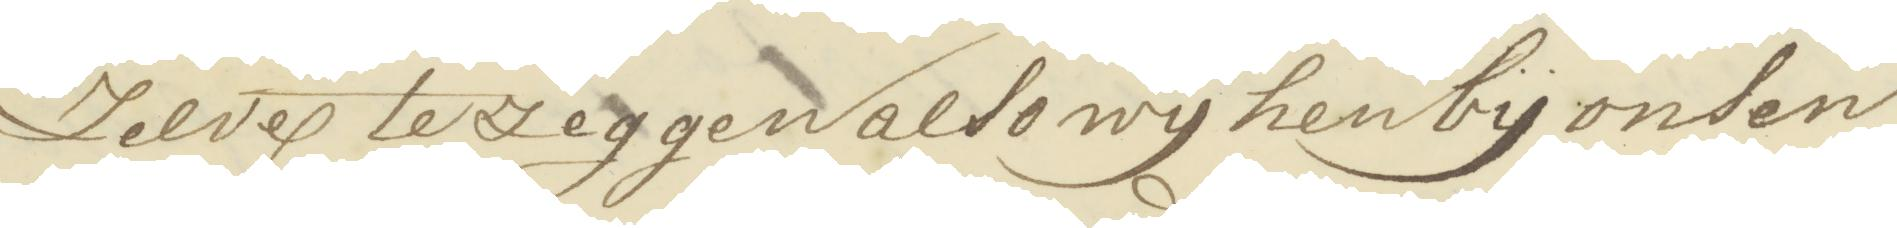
Zelve te zeggen also wij hen bij onsen
